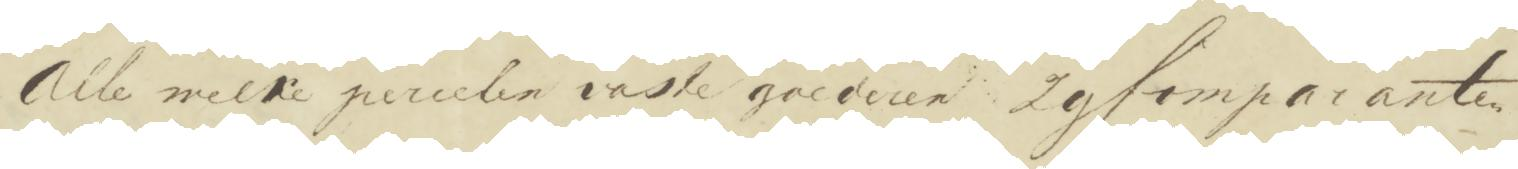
Alle welke percelen vaste goederen zy Comparanten
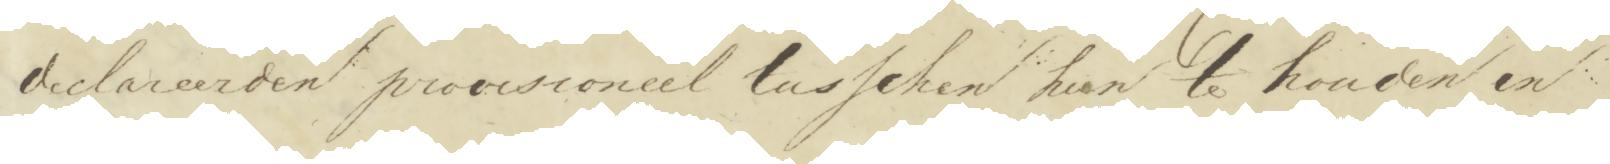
declareerden provisioneel tusschen hun te houden in
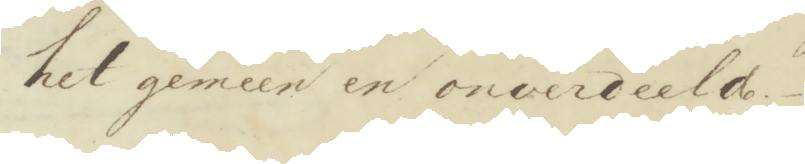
het gemeen en onverdeeld.-
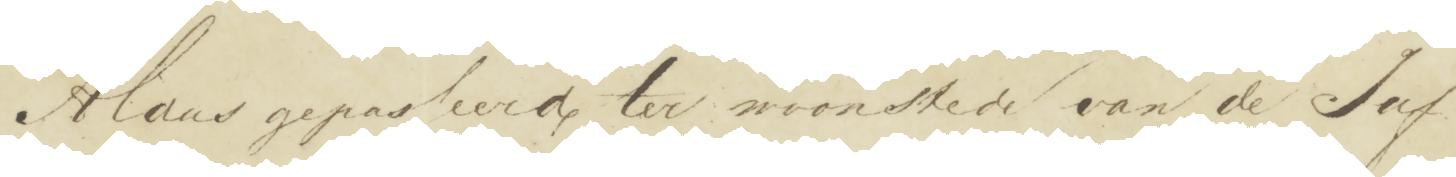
Aldus gepasseerd ter woonstede van de Iuf
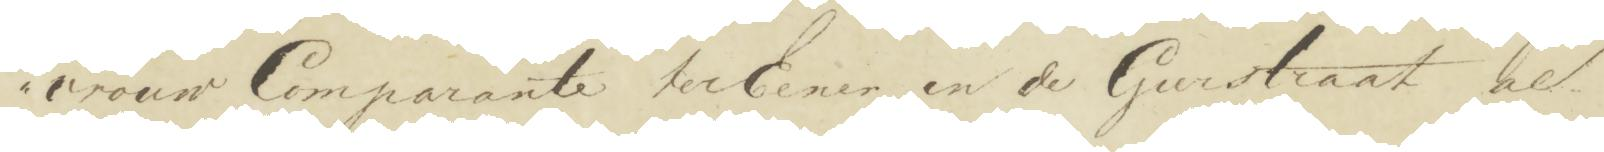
„vrouw Comparante ter Eener in de Geerstraat al
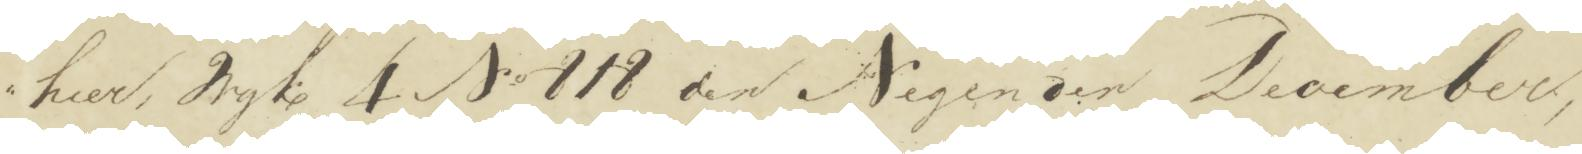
hier, Wyk 4. N.o 818 den Negenden December,
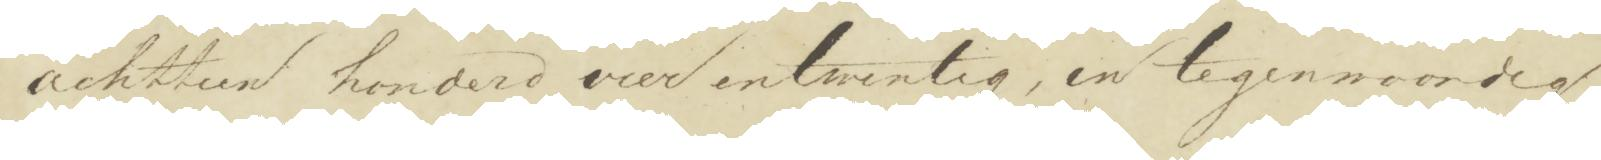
achttien honderd vier en twintig, in tegenwoordig
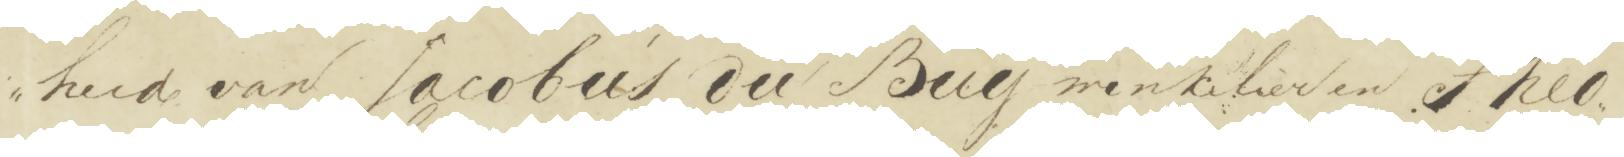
„heid van Jacobus de Buij winkelier en Theo„
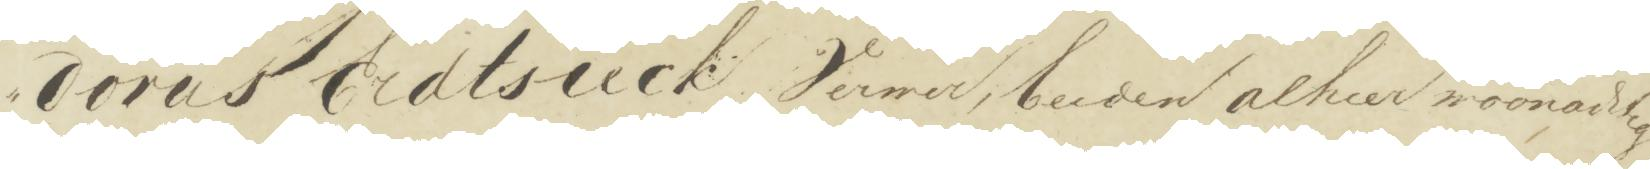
„dorus Erdtsieck Verwer, beiden alhier woonagtig
